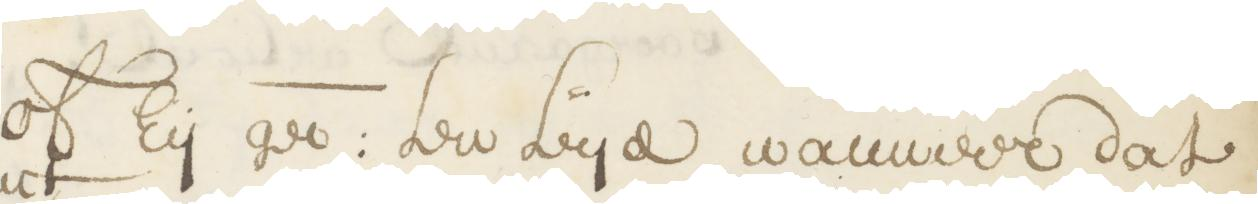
of hij get: ten tijd wanneer dat
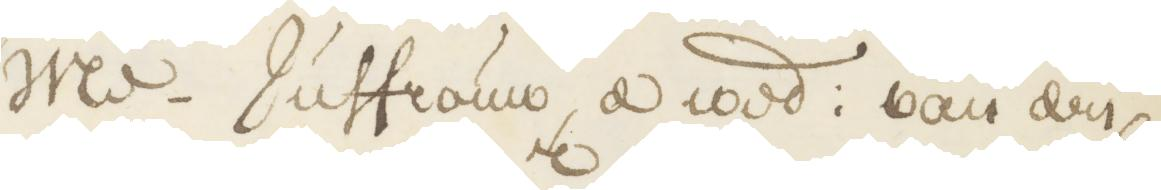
Me- Juffrouw de wed: van den
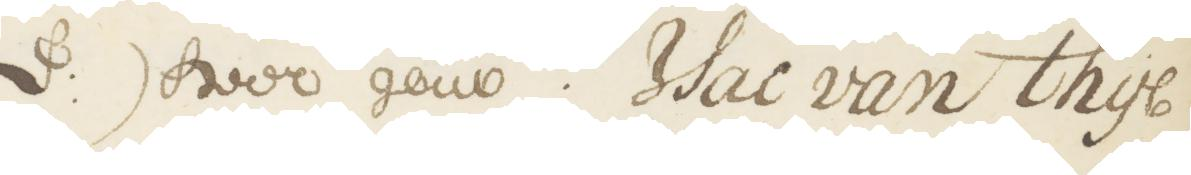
E: heer gouv: Isac van Thije
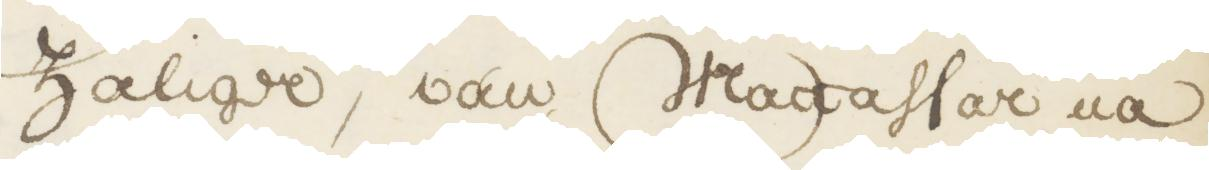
Zaliger, van Maccassar na
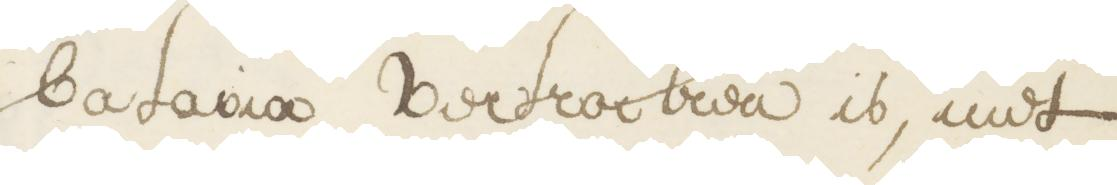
batavia vertrocken is, met
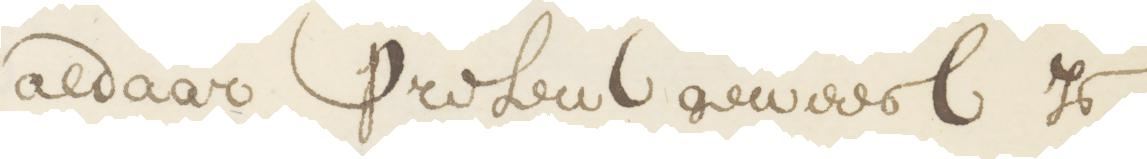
aldaar present geweest is
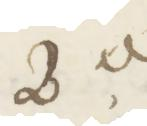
2.e
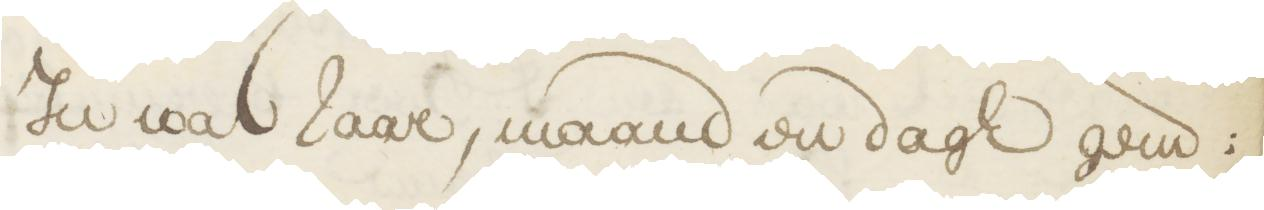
In wat Jaar, maand en dagh gem:
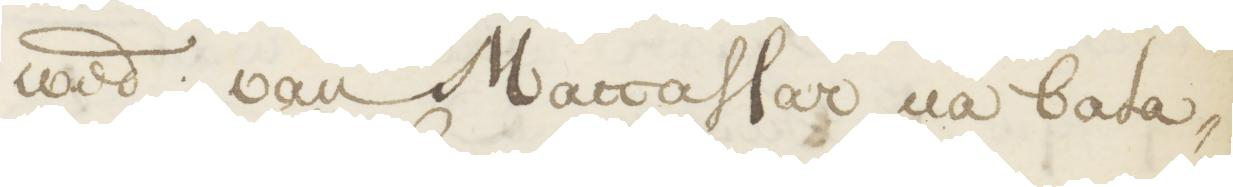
wed: van Maccassar na bata„
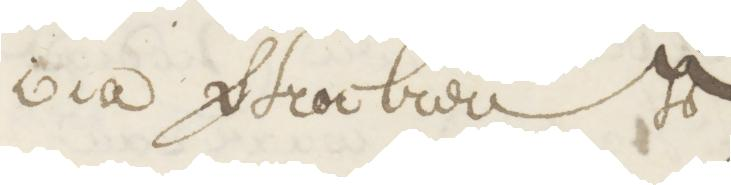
via vertrocken is
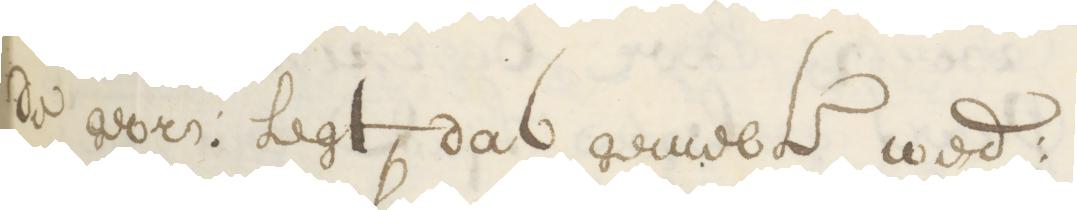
de gevr: segt, dat gemelte wed:
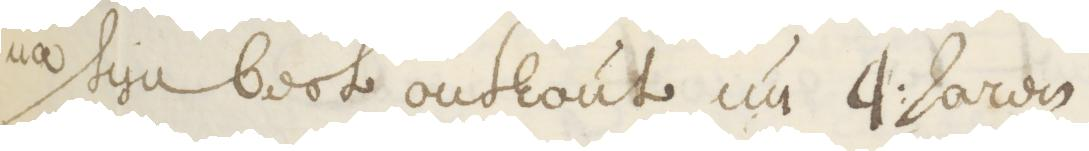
na sijn best onthout nu 4: jaren
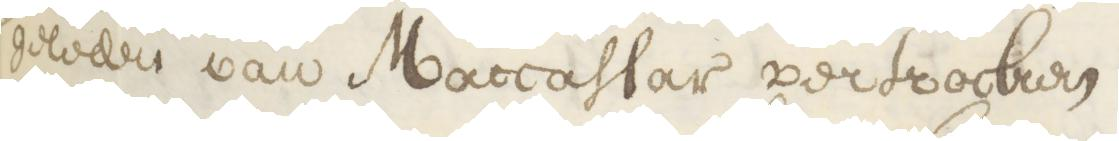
geleden van Maccassar vertrocken
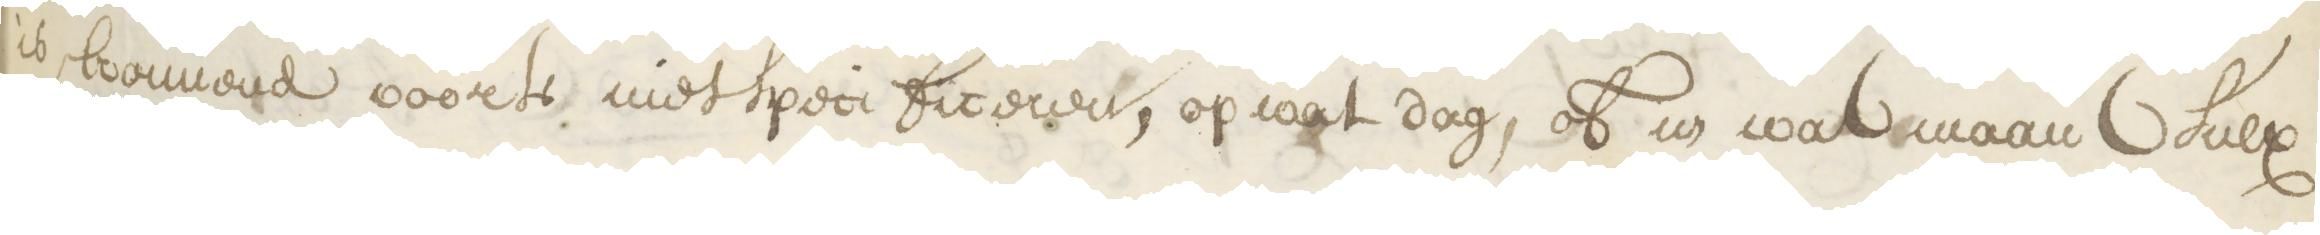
is konnende voorts niet specificeren, of wat dag, of en wat maar t Sulx
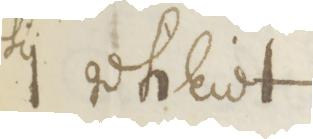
sij geschiet
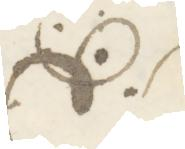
d:
